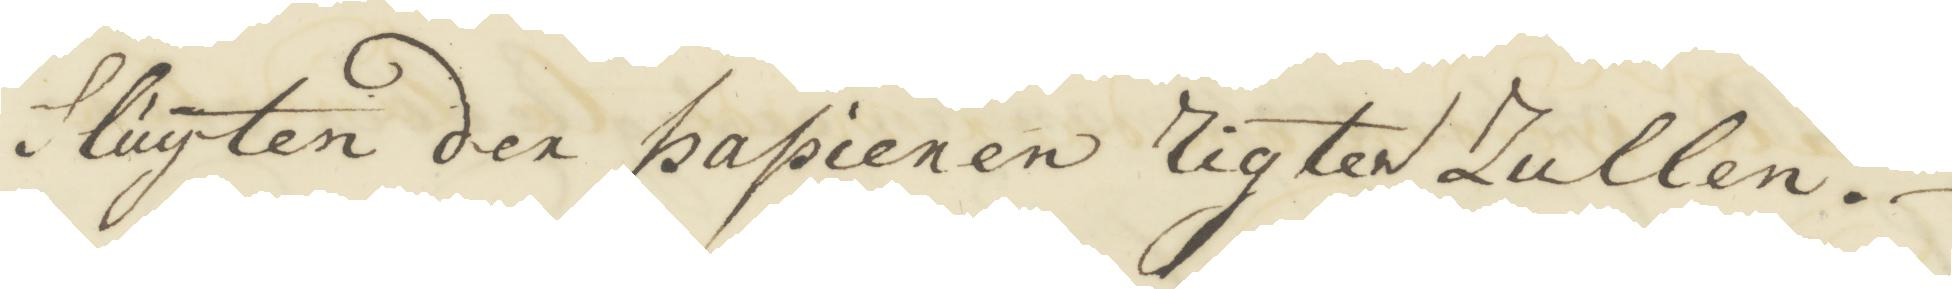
sluijten der papieren rigten zullen.
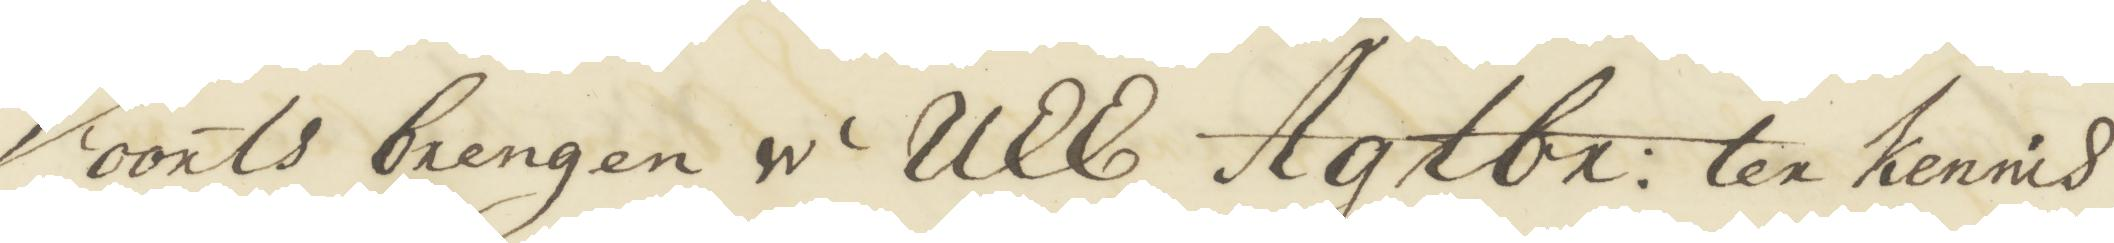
Voorts brengen w' UEE Agtbr: ter kennis
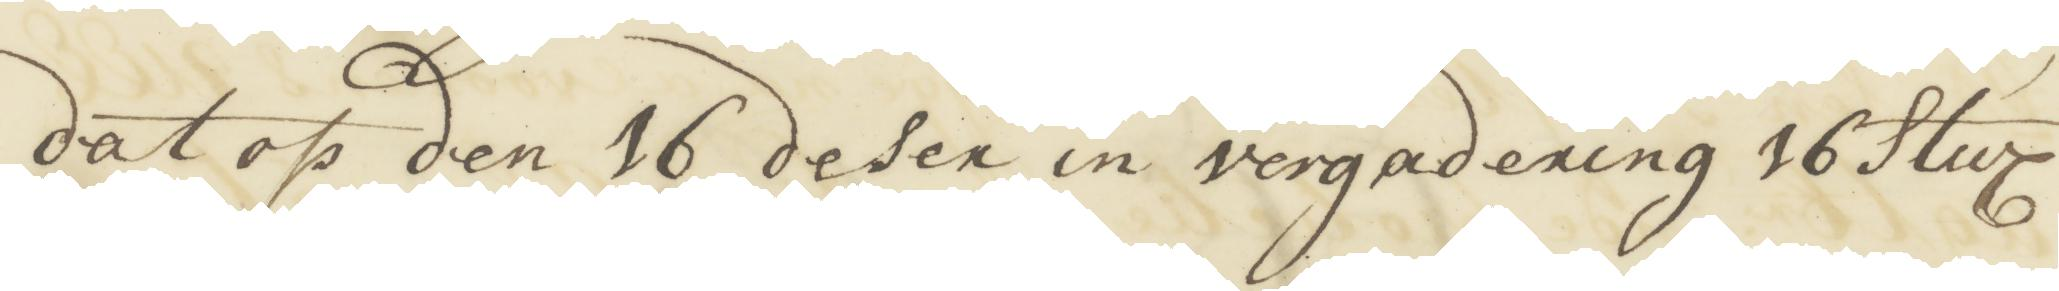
dat op den 16 deser in vergadering 16 stux
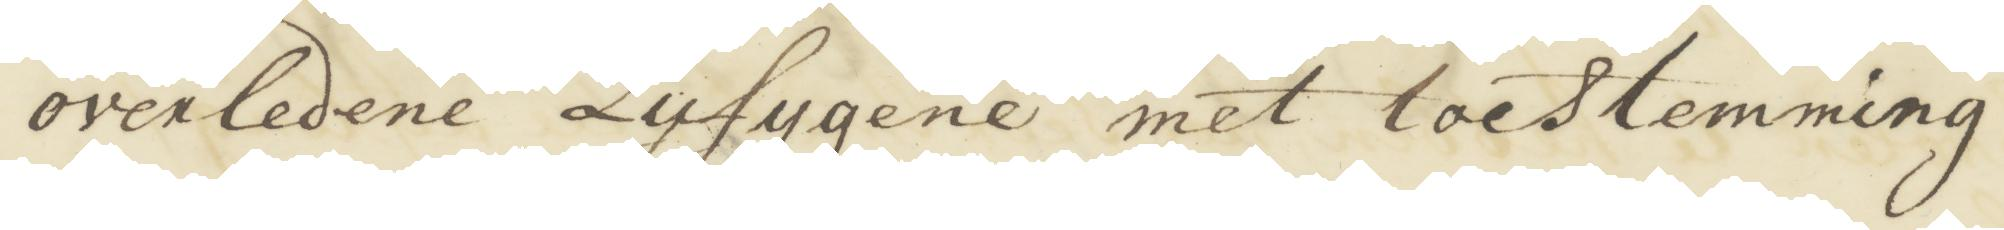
overledene lijfygene met toestemming
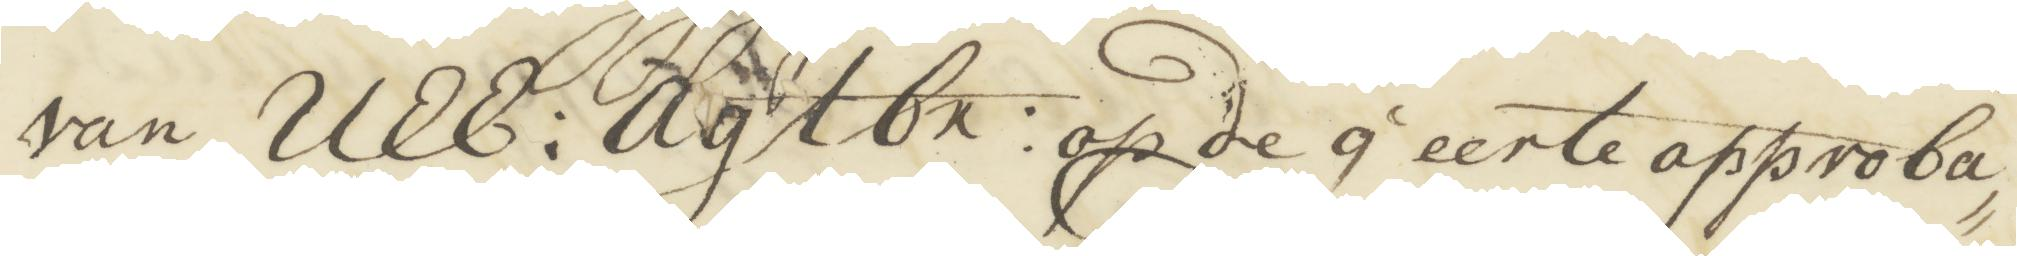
van UEE Agtbr: op de g’eerte approba„
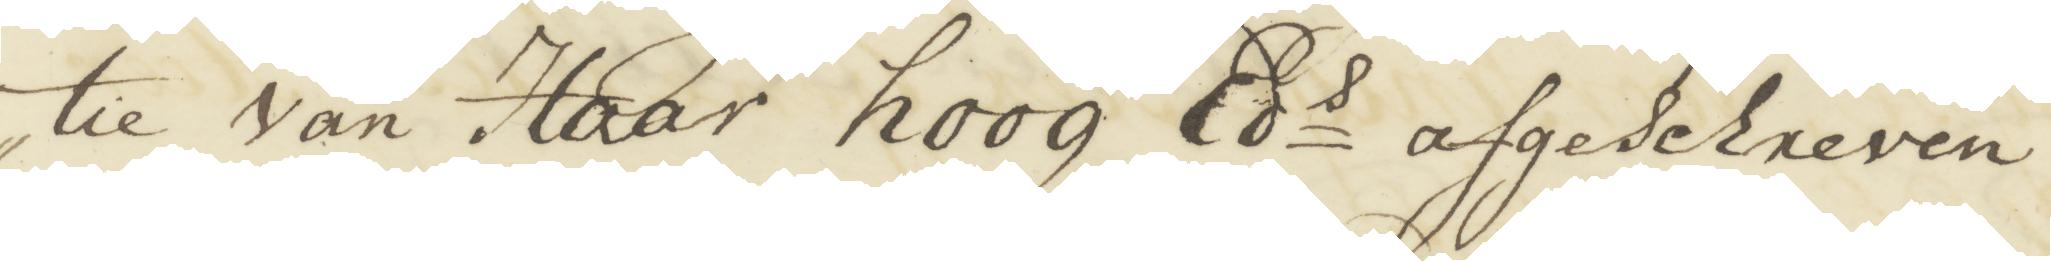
„tie van Haar Hoog Ed=s afgeschreven
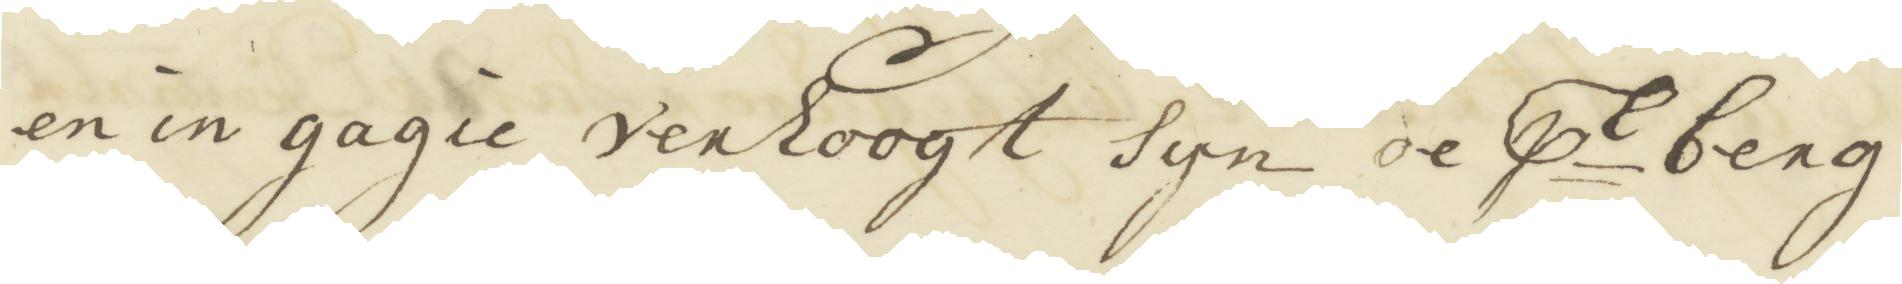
en in gagie verhoogt syn de p=l berg
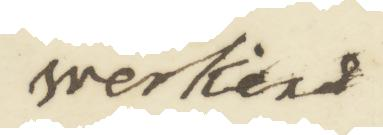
werkers
